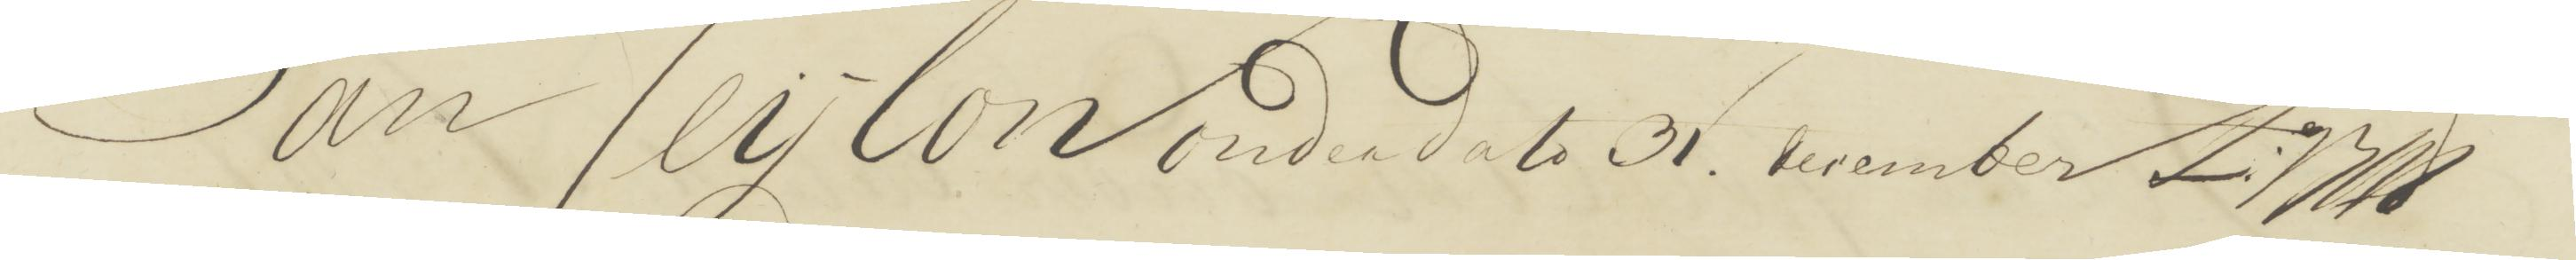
Van Ceijlon onderdato 31. december A:o 1748
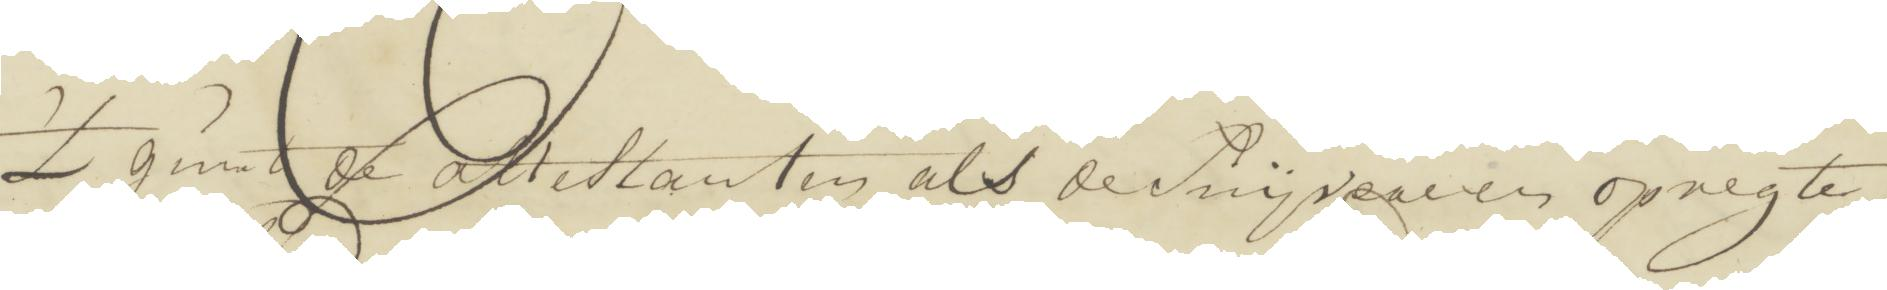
't gunt de attestanten als de suijverven opregte
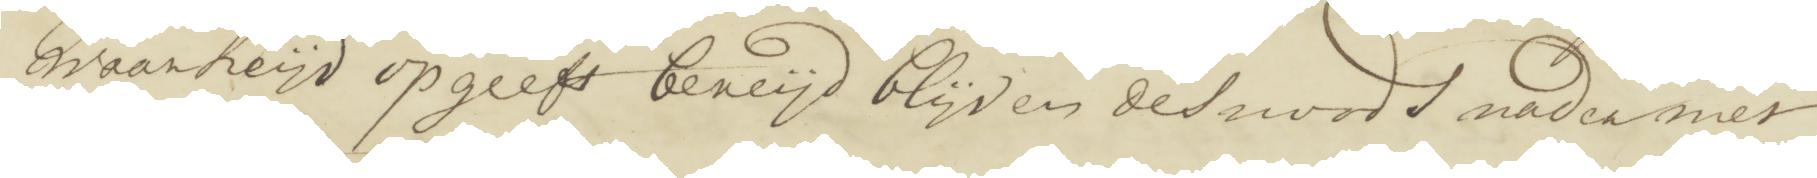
waarheijd op geeft bereijd blijven desnoods nader met
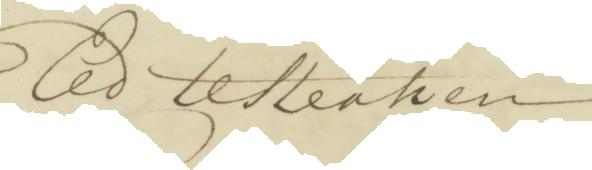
Eed te sterken
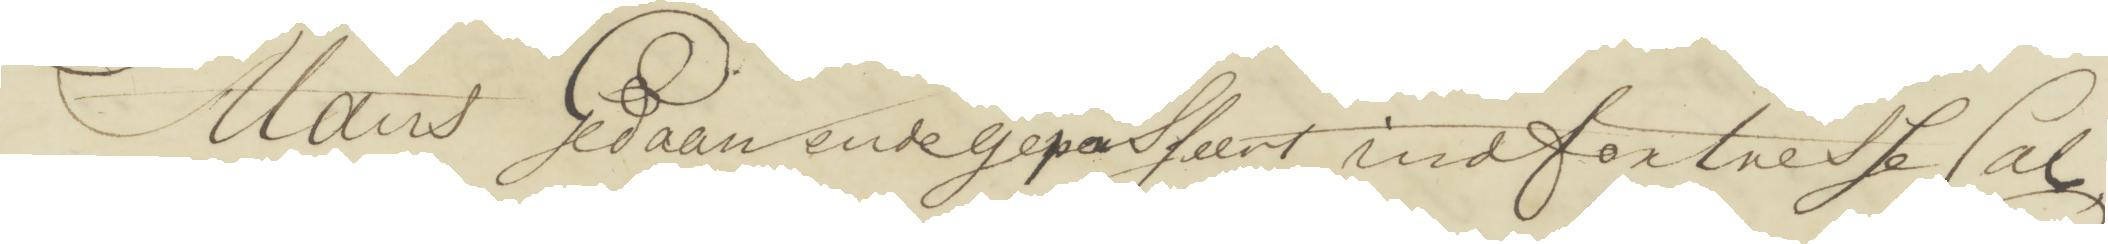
Aldus Gedaan ende gepasseert ind fortresse Cal
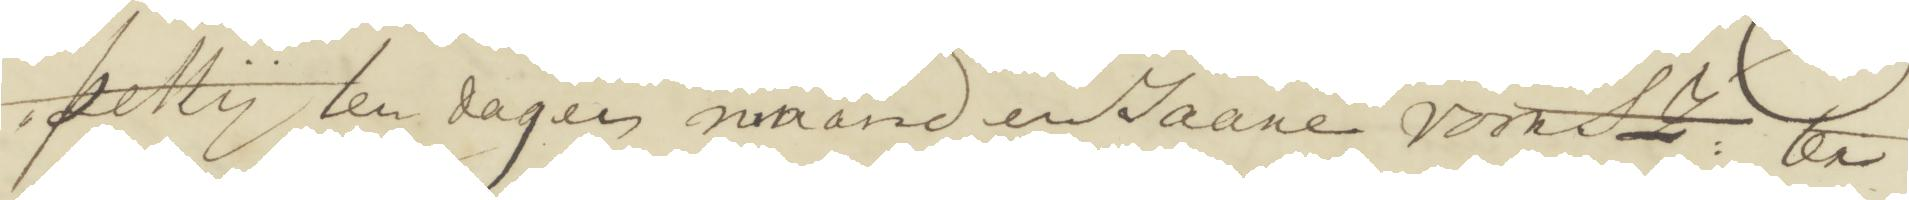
„pettij ten dag en maand en Iaare voorsz: ter
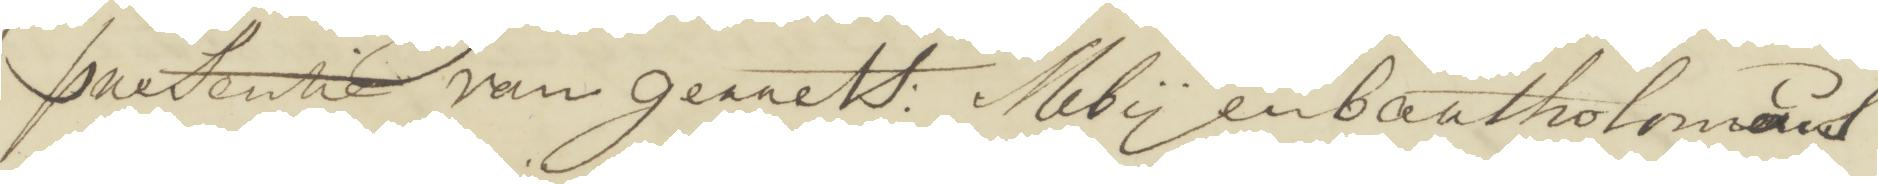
presentie van gerrets: Mebij en bartholomeus
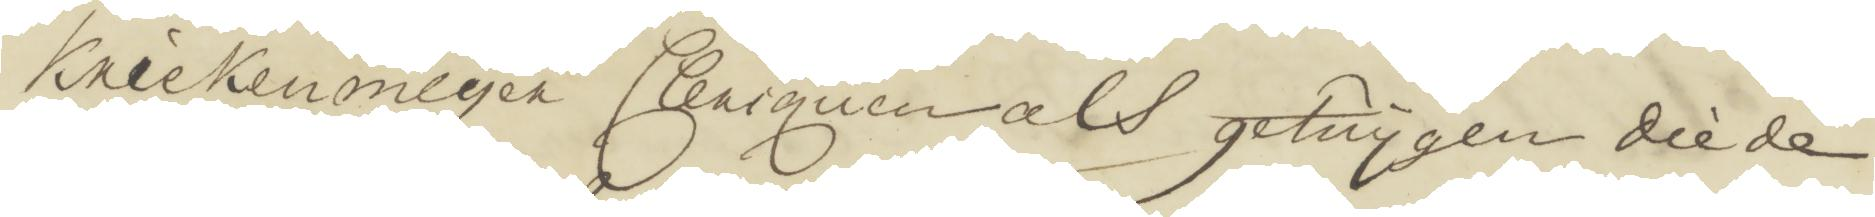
kriekenmeijer Clercquen als getuijgen die de
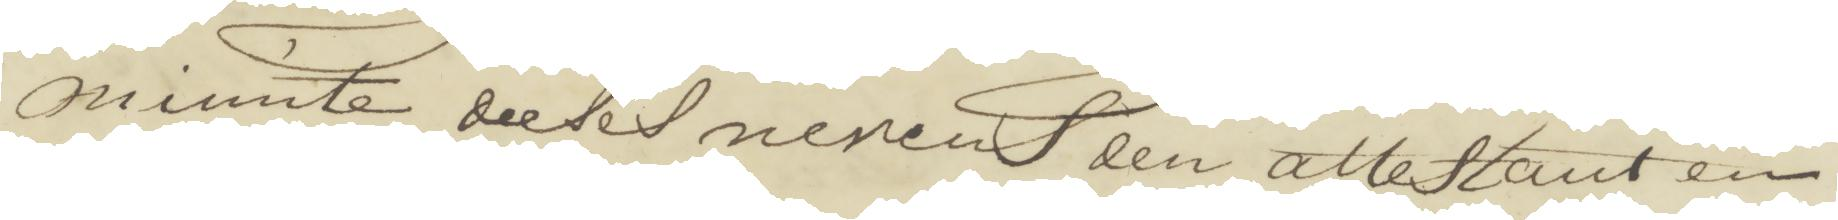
minute deeses nevens den attestant en
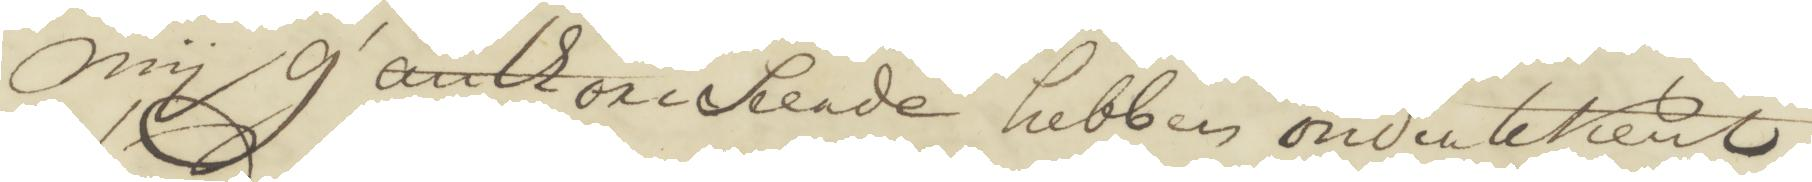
mij g’authoriseerde hebben ondertekent
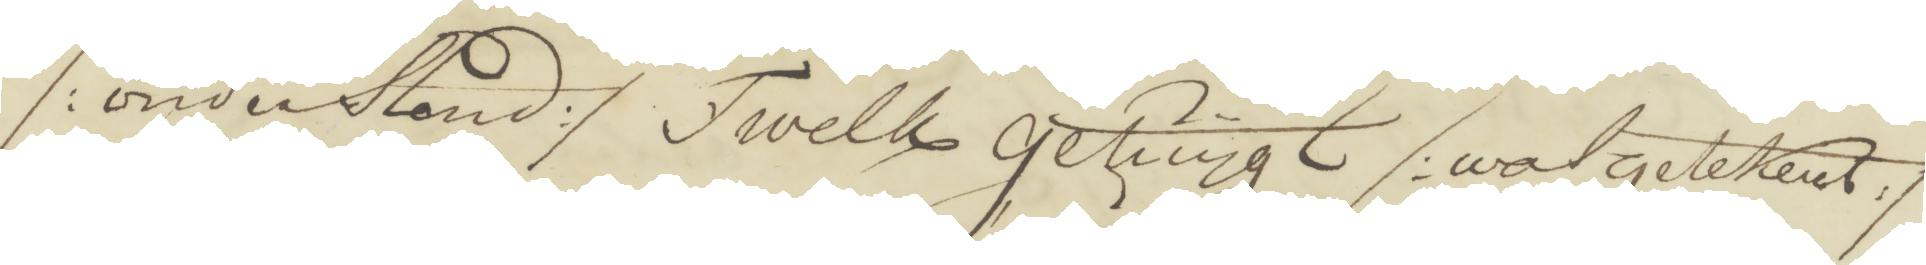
/:onderstond:/ 'Twelk getuijgt /:was getekent:/
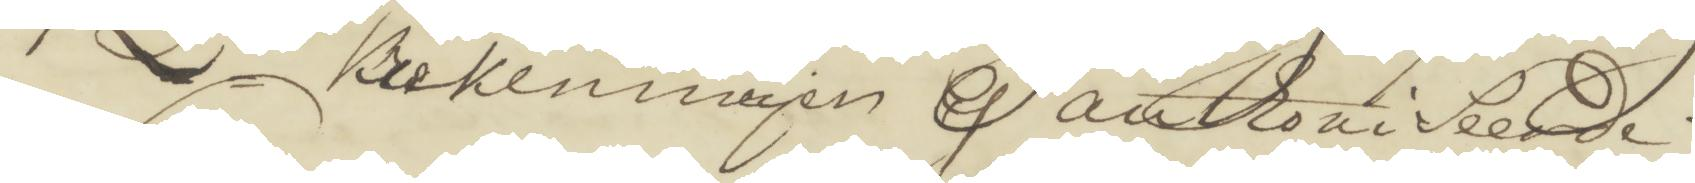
L=s krekenmeijer g'authoriseerde
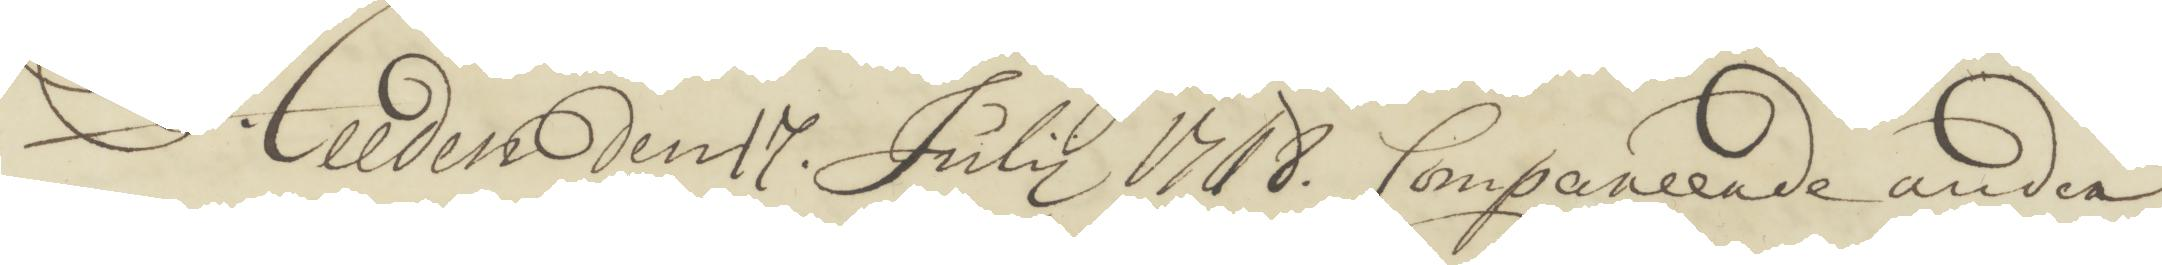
Heeden den 17. Julij 1748. Compareerde ander
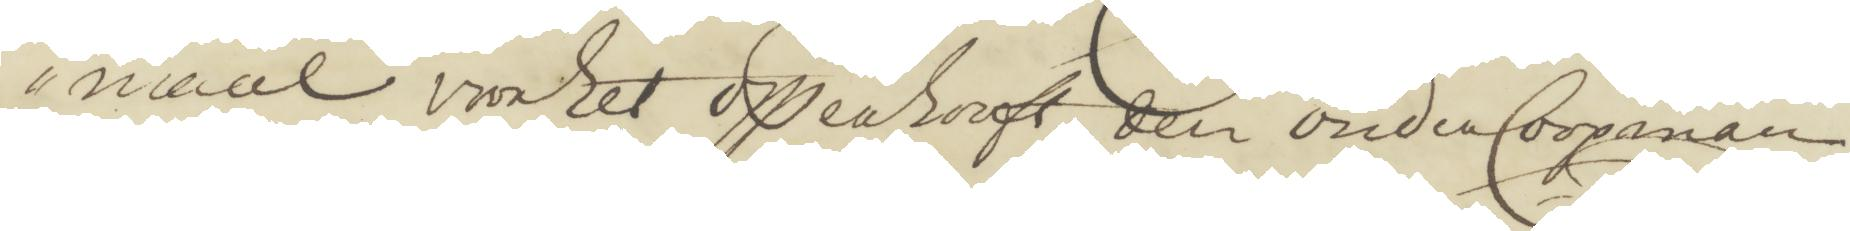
„maal voor het opperhooft den onderCoopman
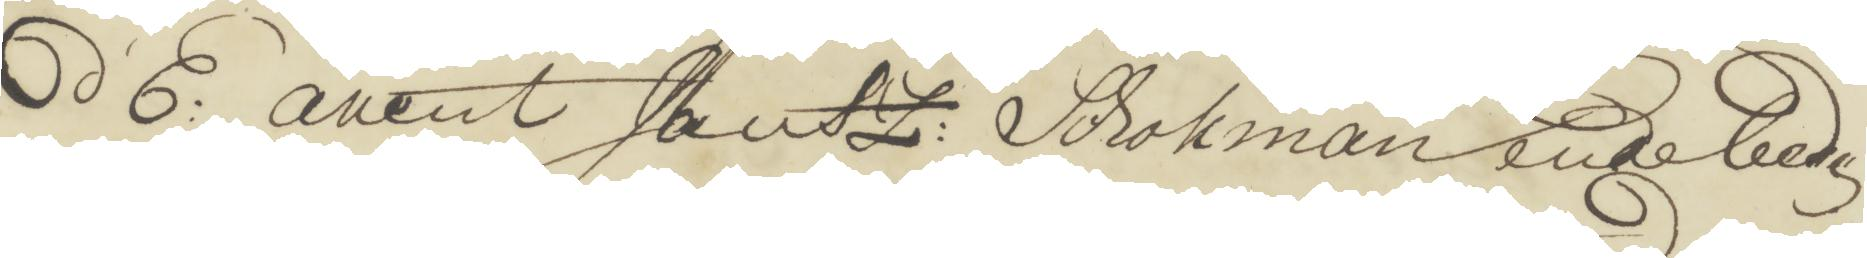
d’ E: arent Jansz: Schokman ende leeden
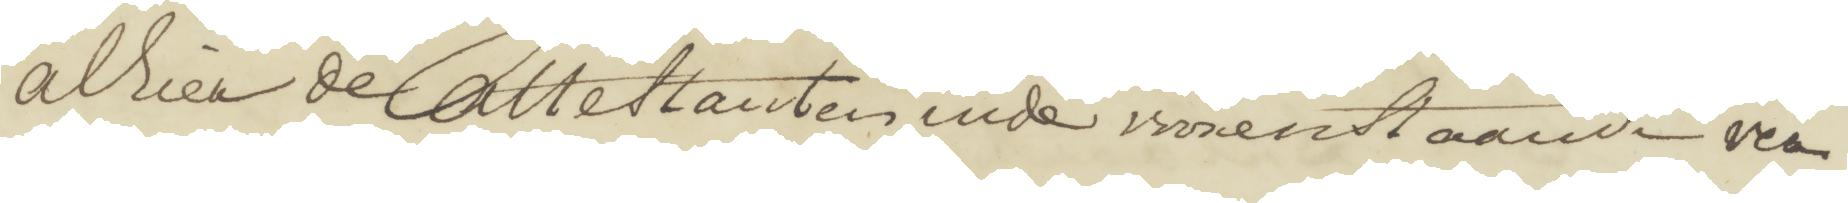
alhier de attestanten inde voorenstaande ver
